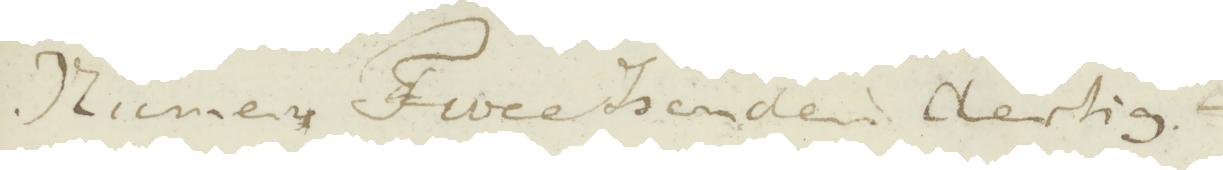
Numero Tweehonderd dertig.
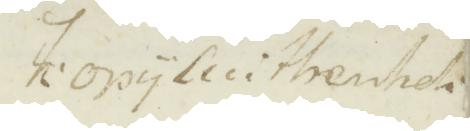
Kopij Authentiek
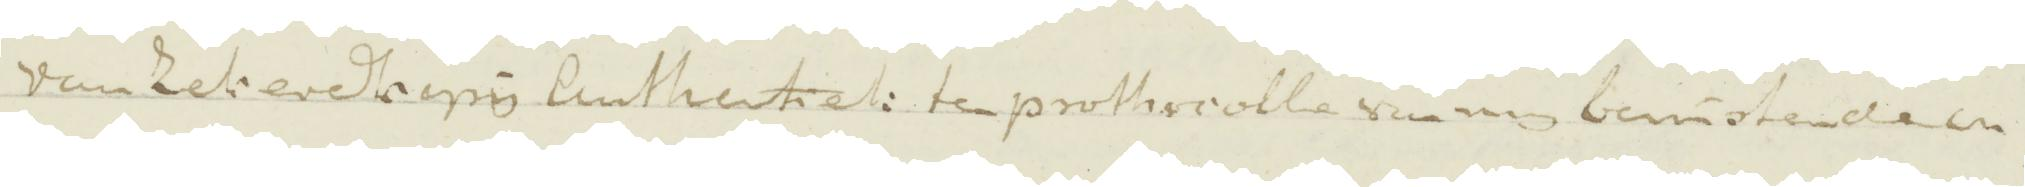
van zeker kopij Authentiek: ten prothocolle van my berustende on
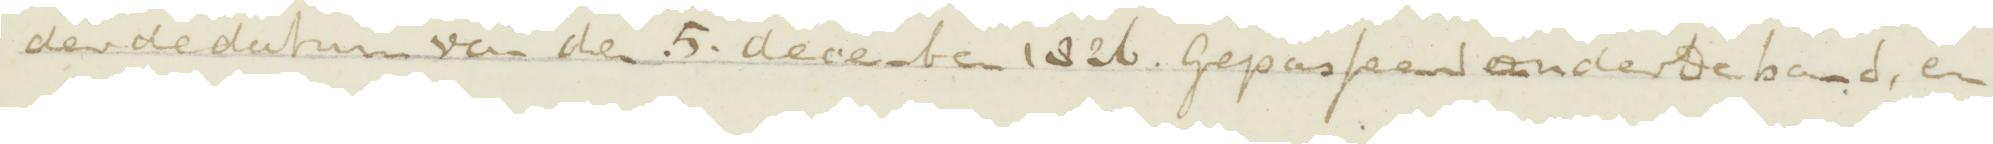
der de datum van den 5. december 1826. Gepasseerd onder de hand, en
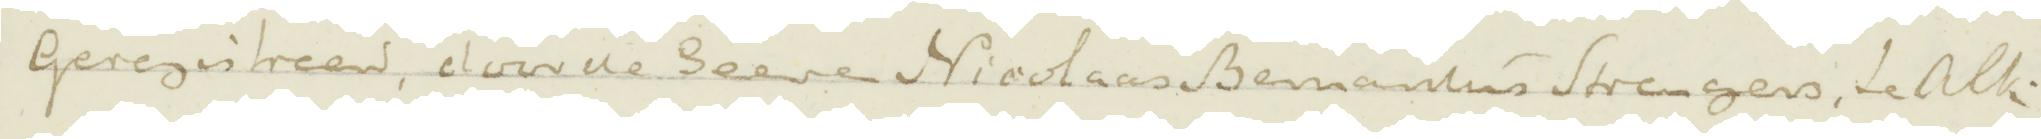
Geregistreerd, door de heeren Nicolaas Bernardus Strengers, te Alk
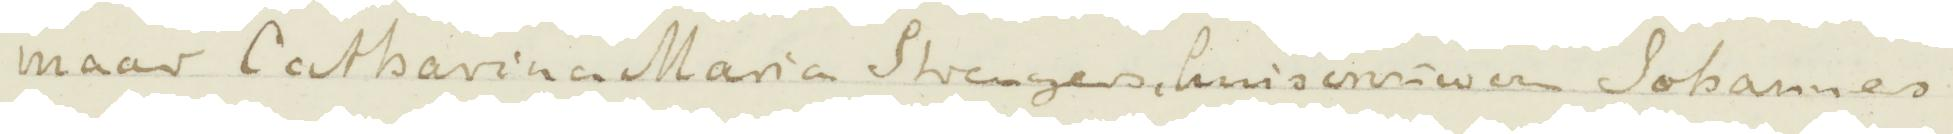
maar Catharina Maria Strengers, huisvrouw en Johannes
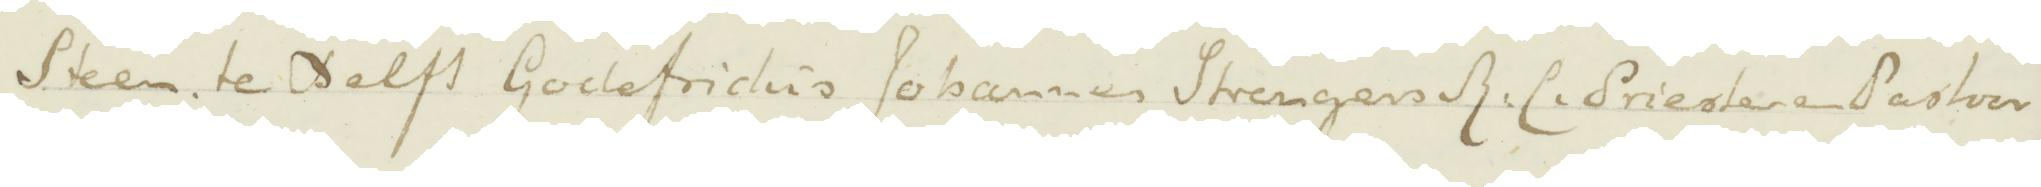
Steen, te delft Godefridus Johannes Strengers R: C: Priester en Pastoor
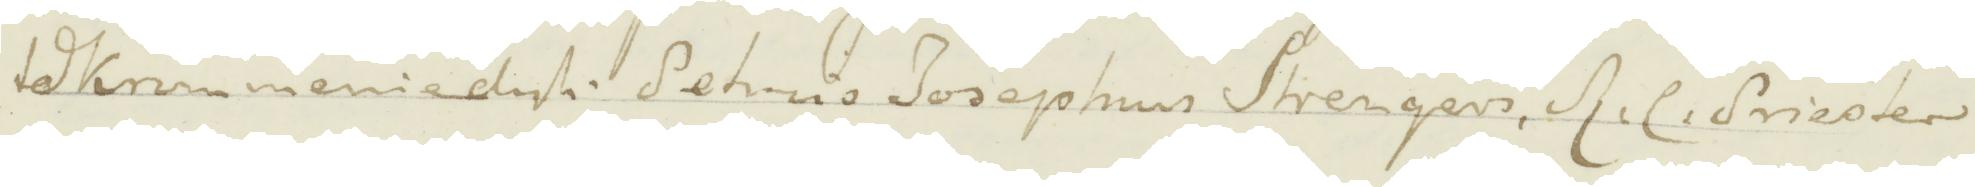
te Krommeniedyk Petrus Josephus Strengers, R: C: Priester
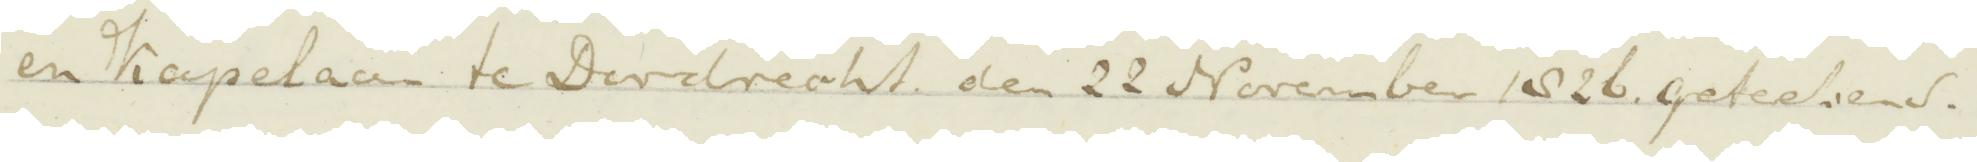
en Kapelaan te Dordrecht den 22 November 1826. Geteekend.
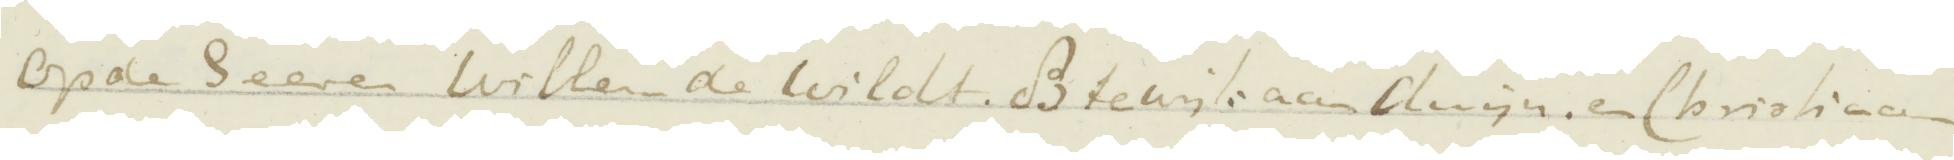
op de heeren Willem de Wildt. B te wijk aan duijn, en Christiaan
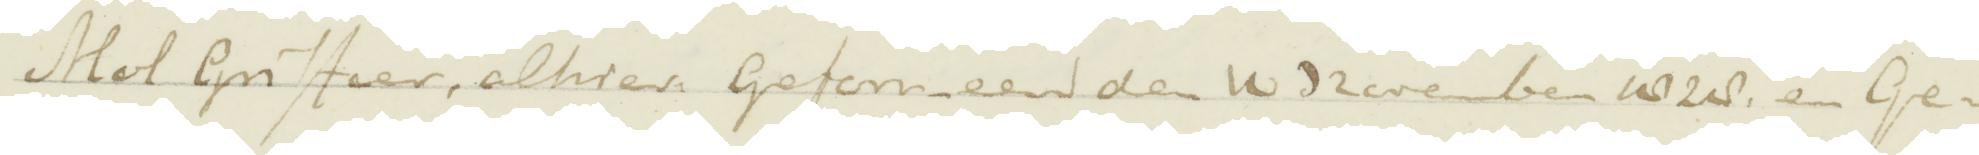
Mol Gusteer, alhier geformeerd den 10 november 1828, en Ge=
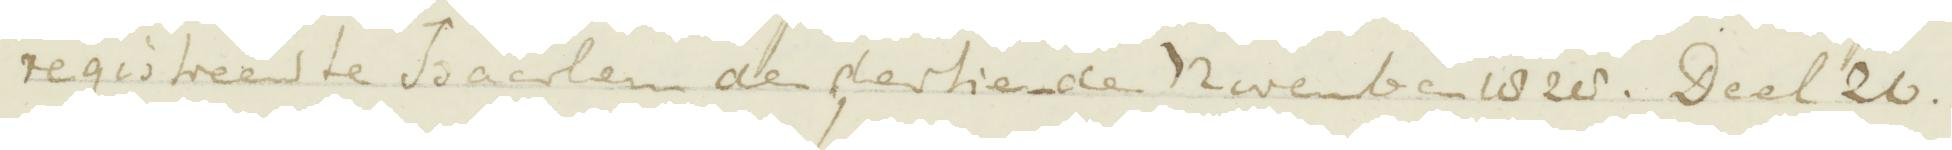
registreerd te Haarlem den dertiende november 1828. Deel 26.
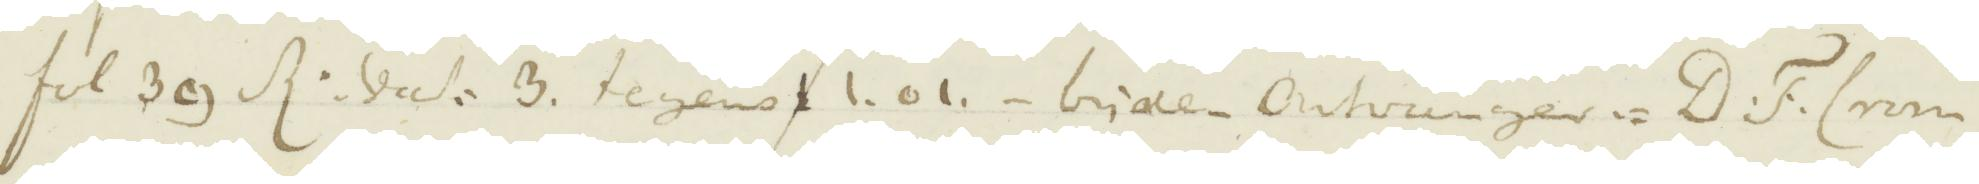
fol 39 R: Vak 3. tegens ƒ1.01.– bij den ontvanger D.F. Crom
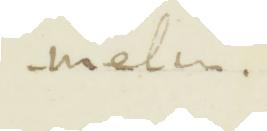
-melin.
